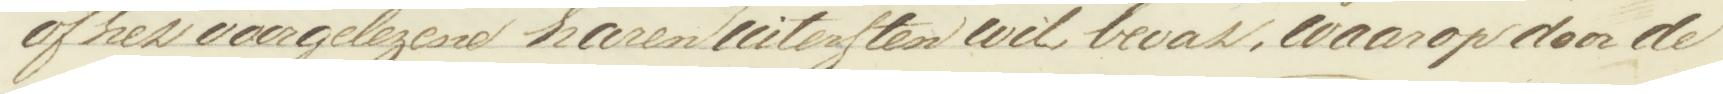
of het voorgelezene haren uitersten wil bevat, waarop door de
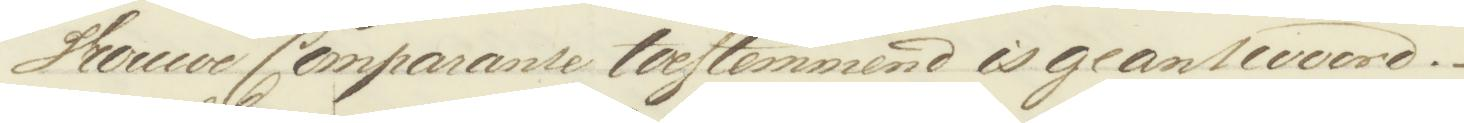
Vrouwe Comparante toestemmend is geantwoord.
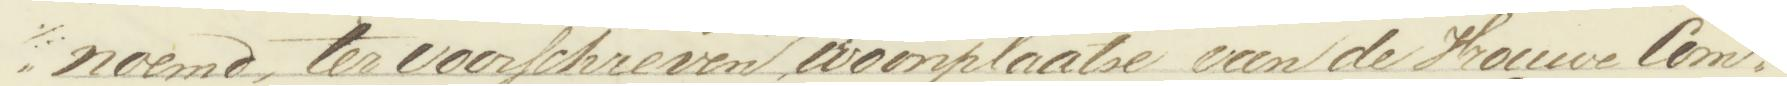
„noemd, ter voorschreven, woonplaatse van de Vrouwe Com„
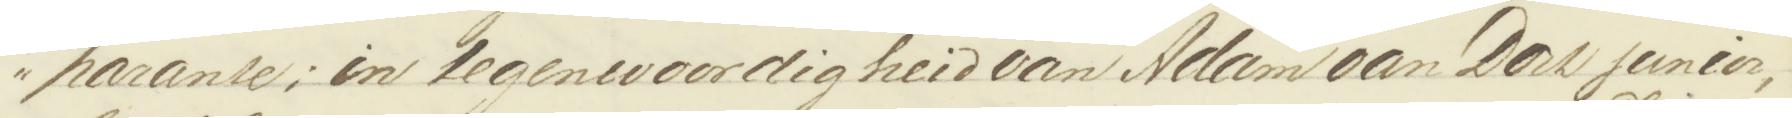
„parante; in tegenwoordigheid van Adam van Dort junior,
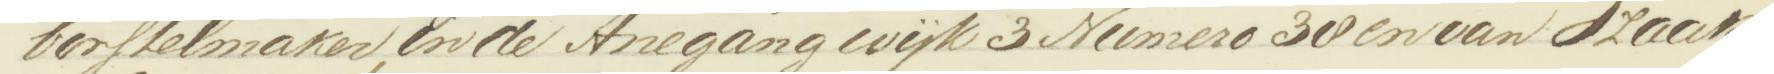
borstelmaker, in de Anegang wijk 3 Numero 38 en van Izaak
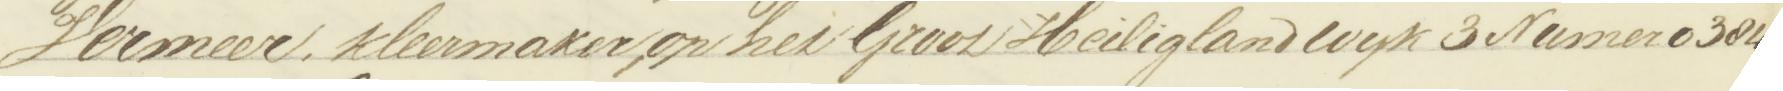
Vermeer, kleermaker, op het Groot Heiligland wyk 3 Numero 384,
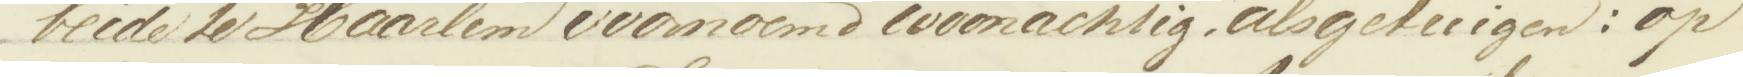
beide te Haarlem voornoemd woonachtig, als getuigen: op
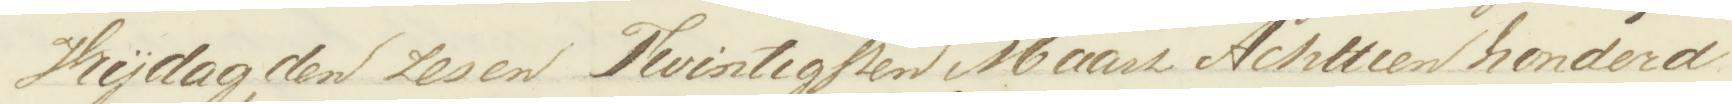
Vrijdag den zes en Twintigsten Maart Achttien honderd
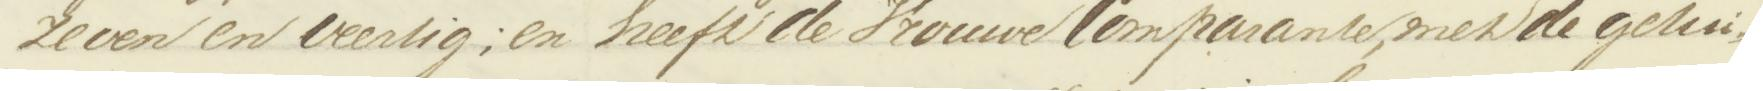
zeven en veertig; en heeft de Vrouwe Comparante, met de getui„
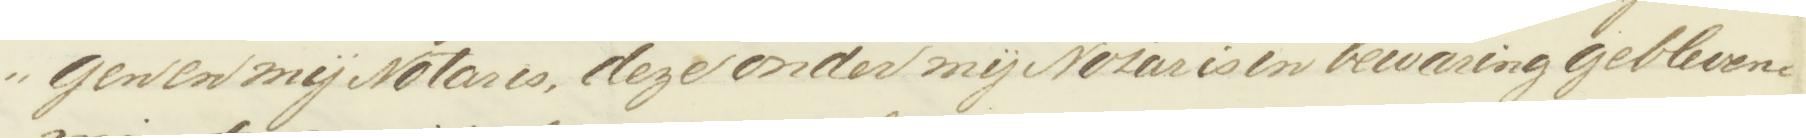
„gen en mij Notaris, deze onder mij Notaris in bewaring gebleven
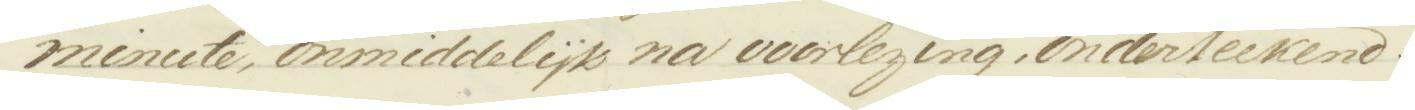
minute, onmiddelijk na voorlezing, onderteekend.
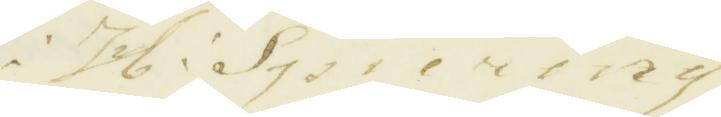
L: H: Spiering
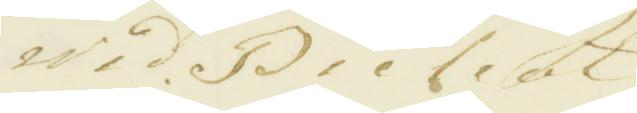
Wed Pichot
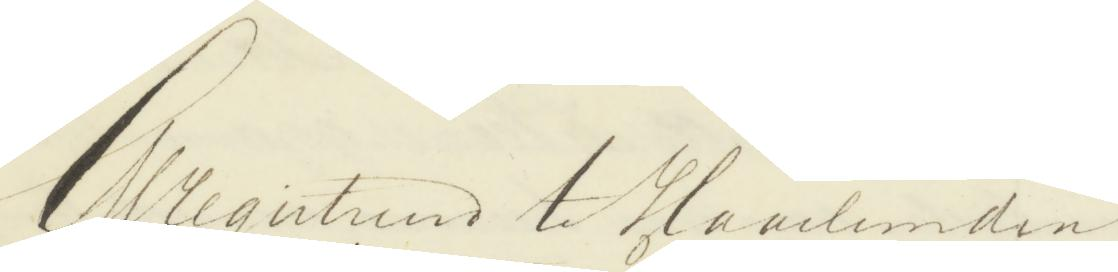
Geregistreerd teHaarlem den
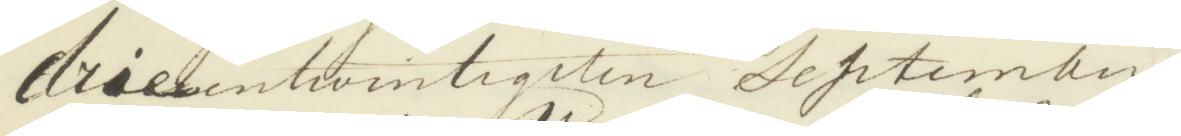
drie entwintigsten September
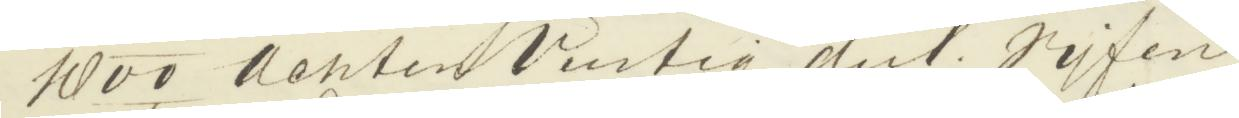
1800 AchtenVeertig deel. vijfen
